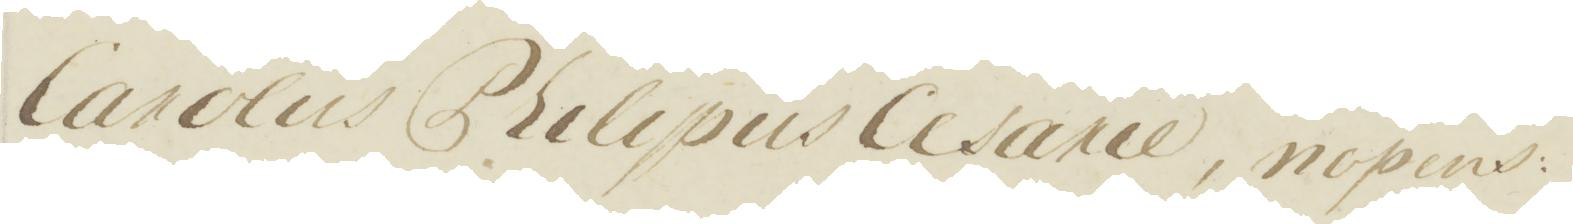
Carolus Philipus Cesarie, nopens:
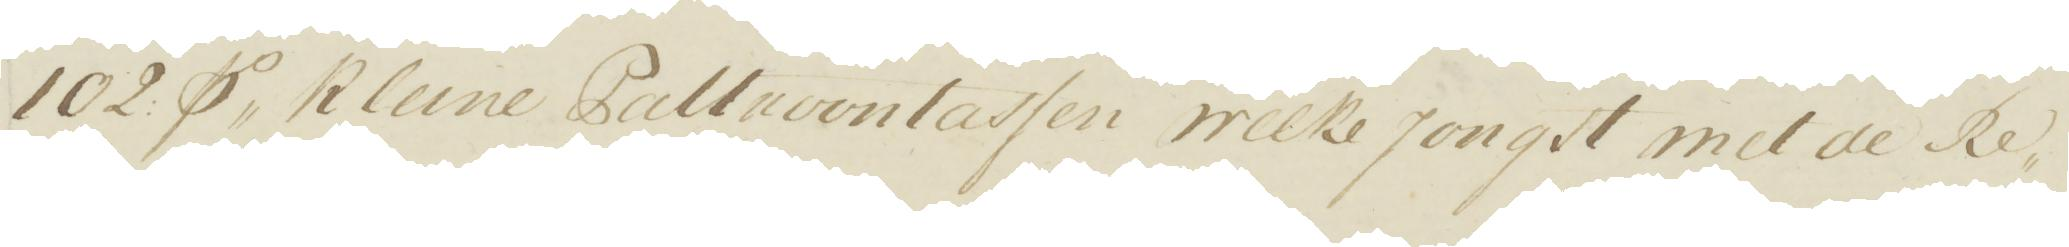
102: p„o kleine Pattroontassen welke jongst met de Re„
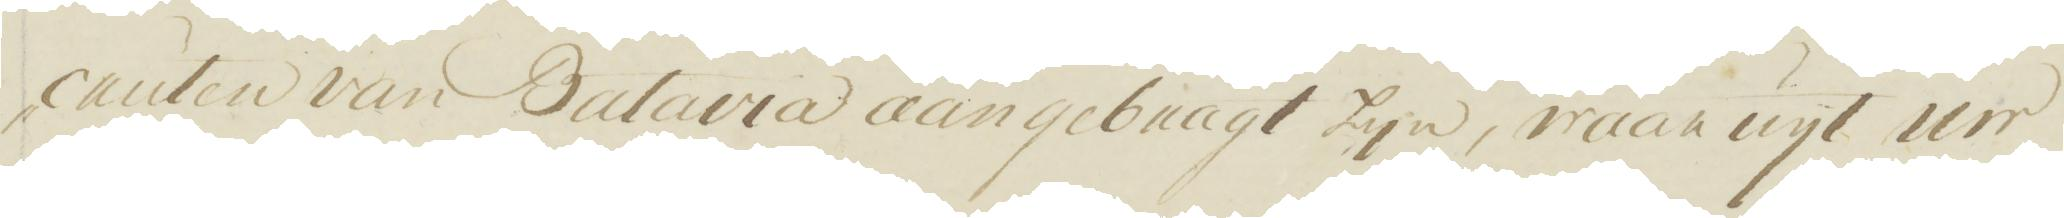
„cruten van Batavia aangebragt sijn, waar uijt uw
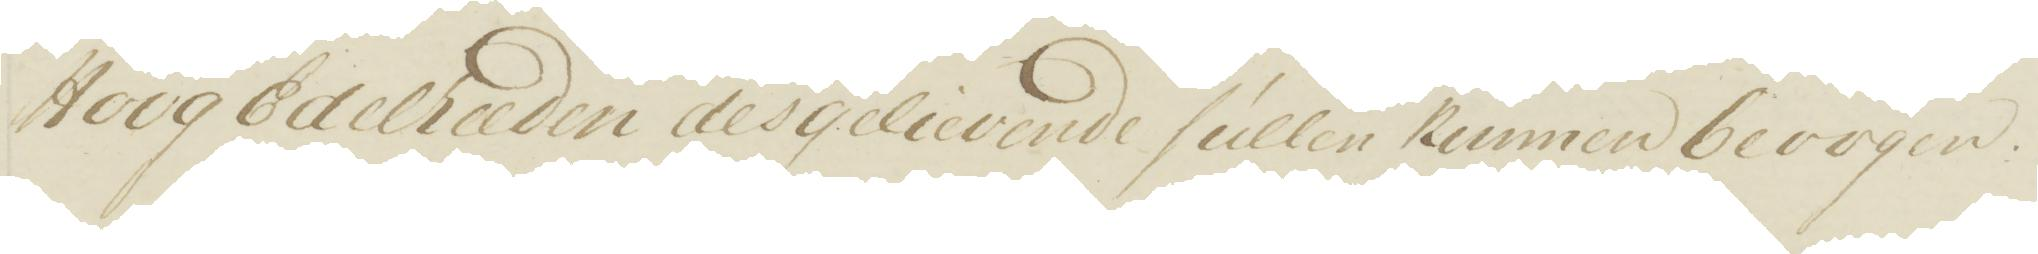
Hoog Edelheeden desgelievende sullen kunnen beoogen.
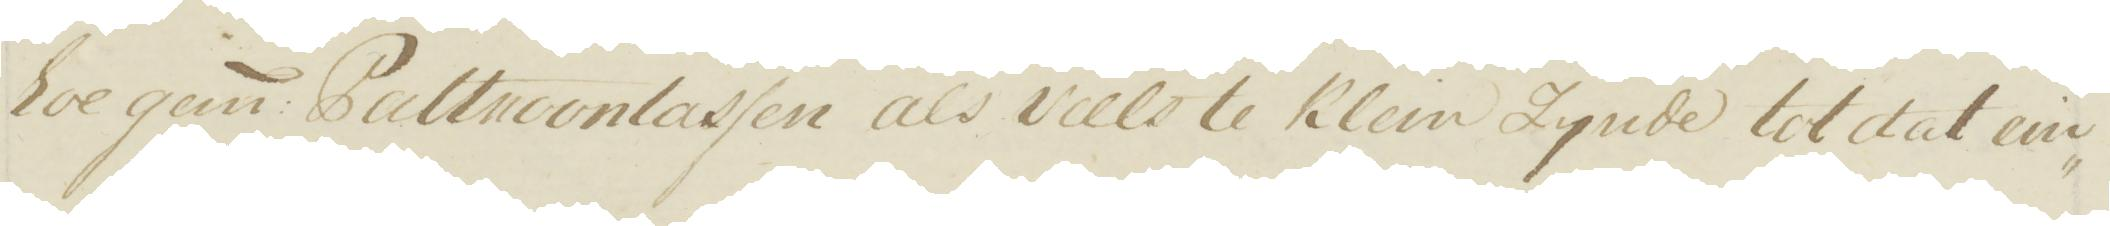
hoe gem: Pattroontassen als veels te klein zijnde tot dat ein„
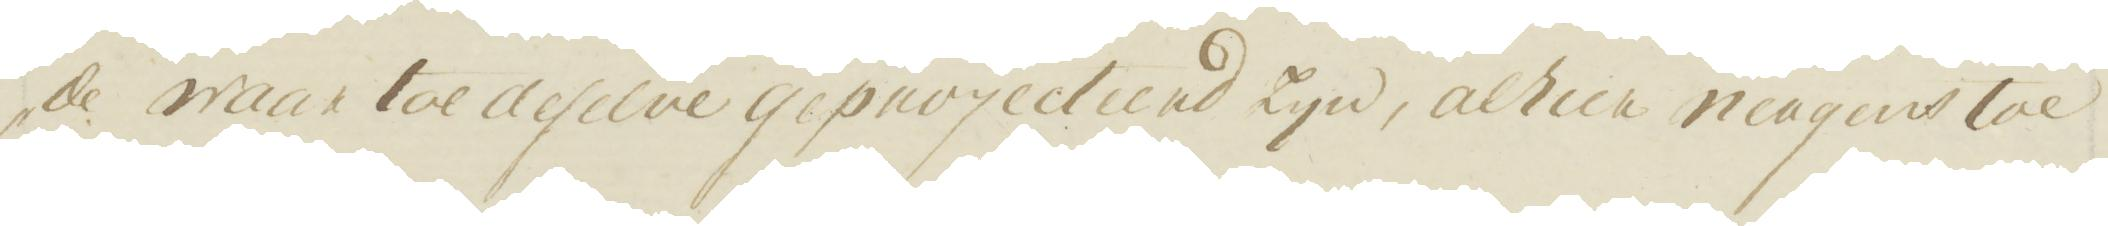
„de waar toe deselve geprojecteerd zyn, alhier nergens toe
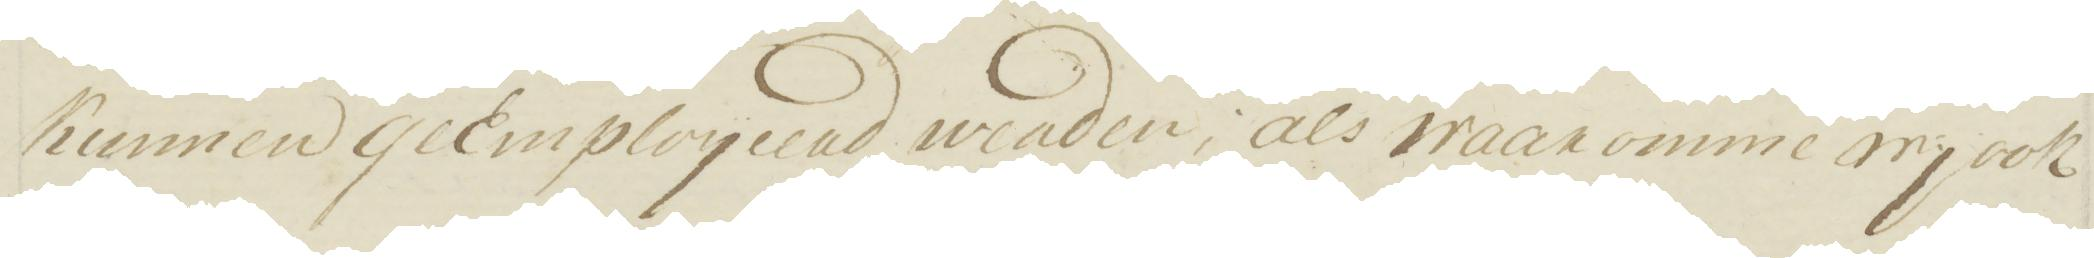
kunnen geEmploijeerd werden; als waar omme wij ook
